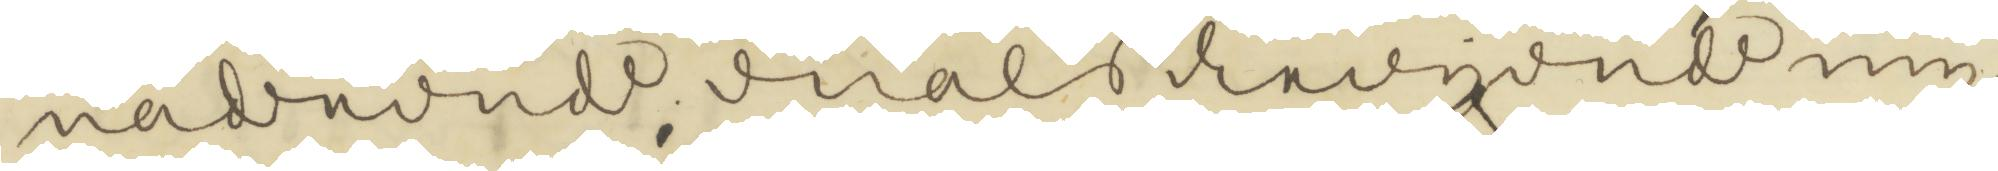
naderende en alschreijende mij
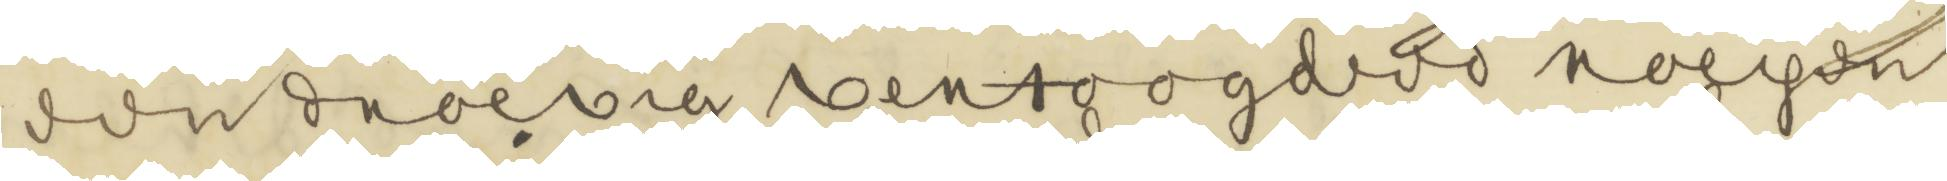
een droevig vertoogdeed roepen
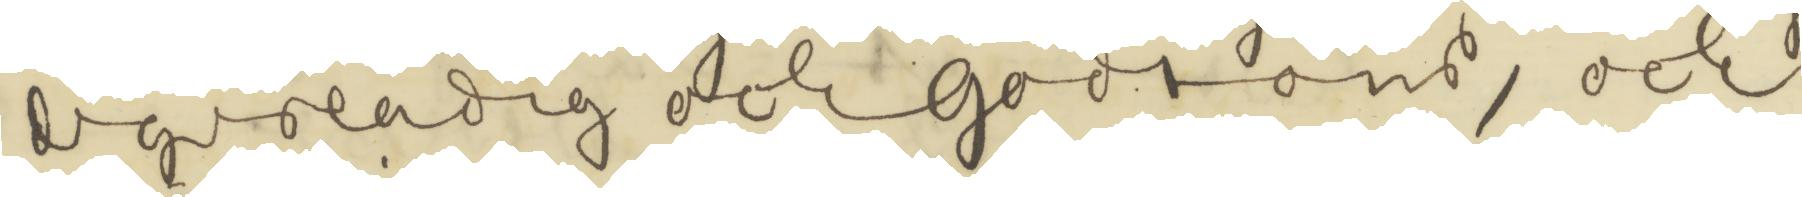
de gestadig och godt ons, och
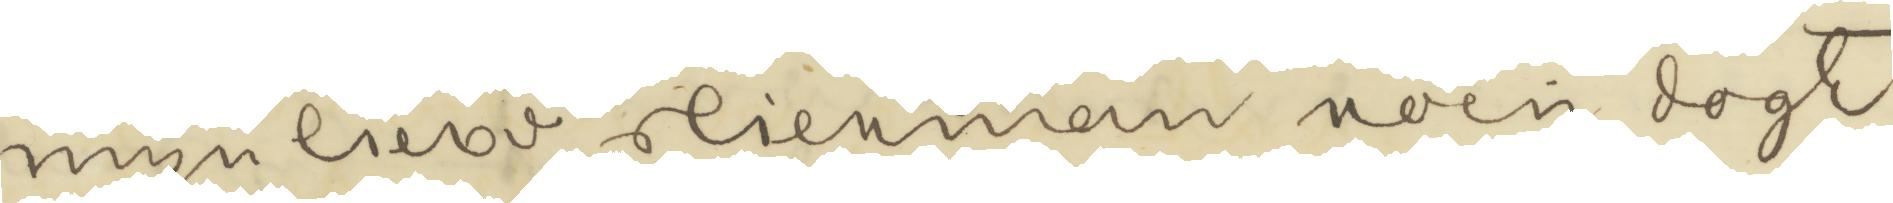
mijn lieve stierman roeij dogh
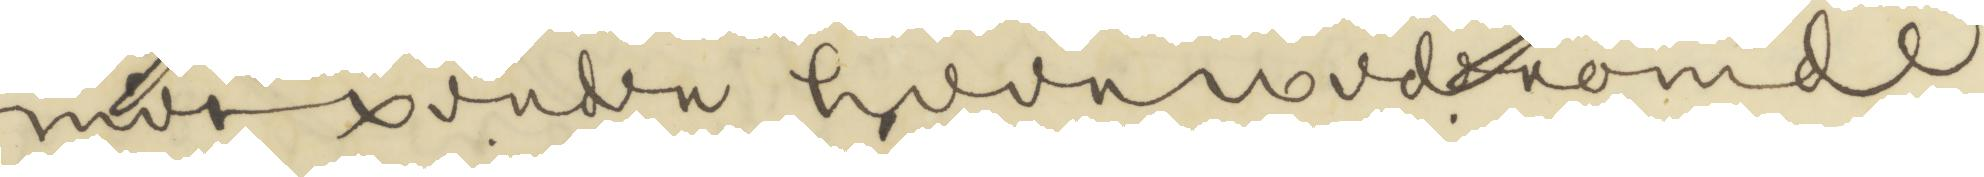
niet verder keer wederom de
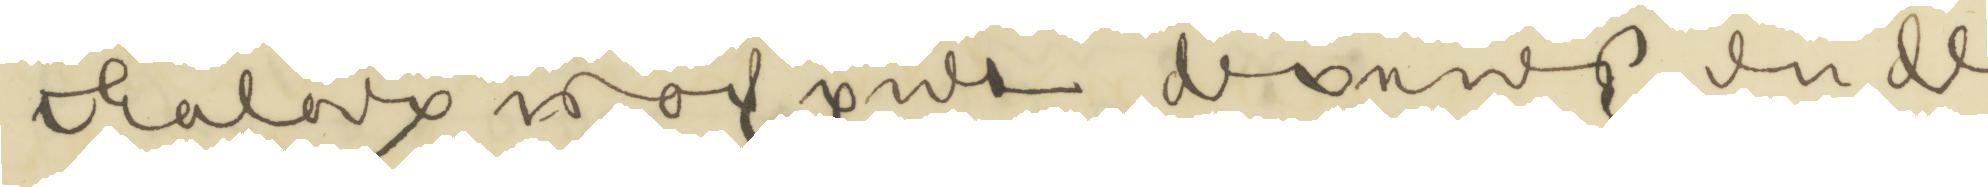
chaloup is over piet de vries en de
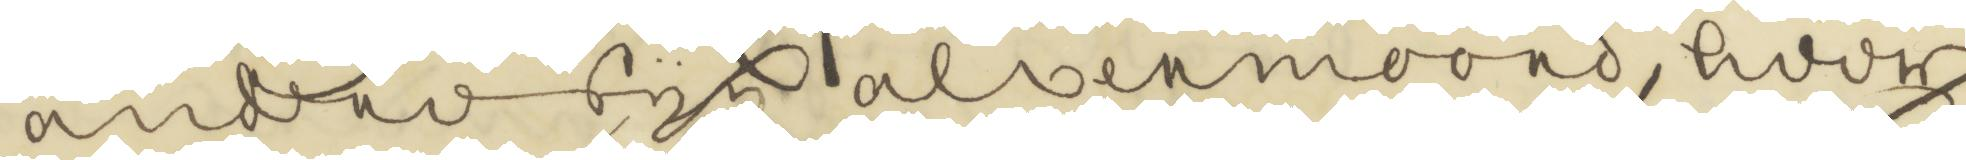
andere sijn al vermoord, keer
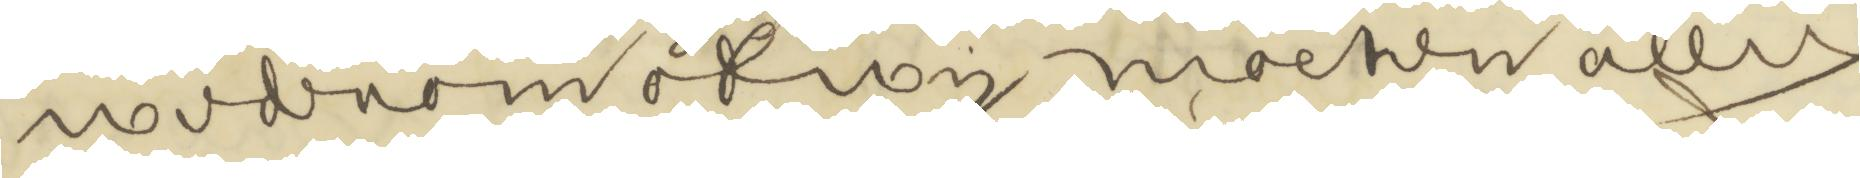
wederom of wij moeten alle
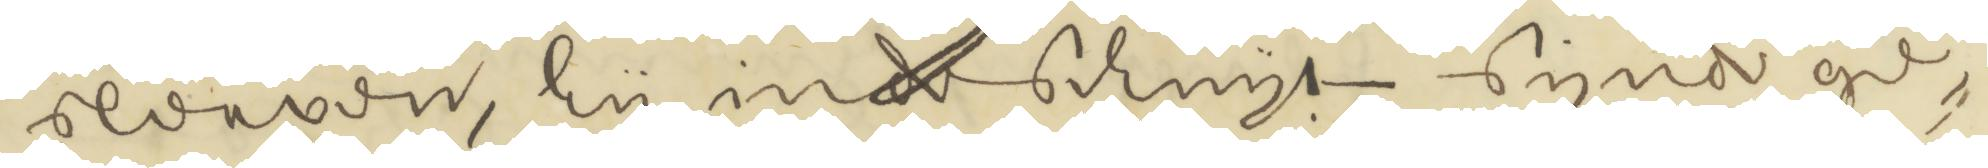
sterven, hij in de schuijt sijnde ge„
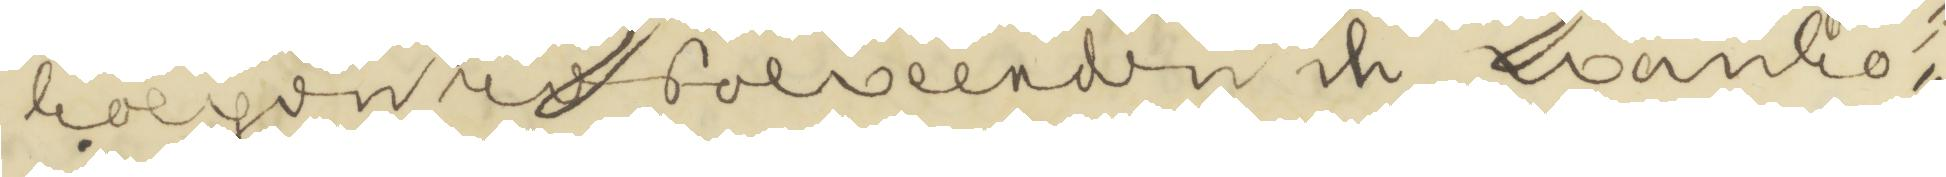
holpen resolveerden ik wanho„
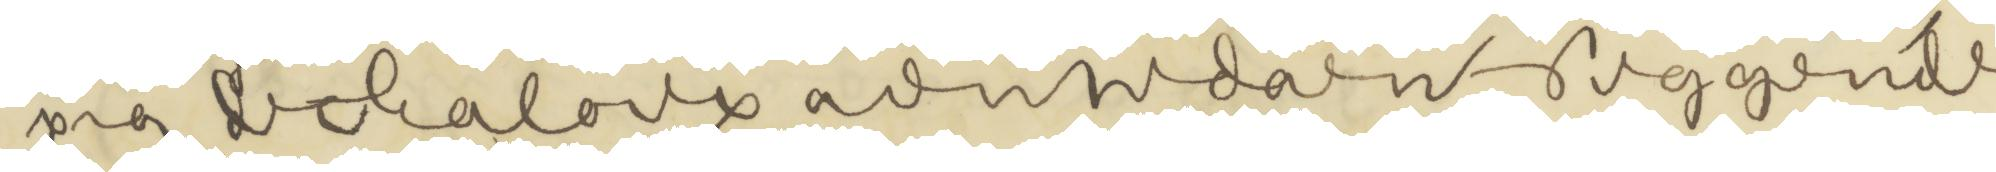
pig de chaloup aen te doen seggende
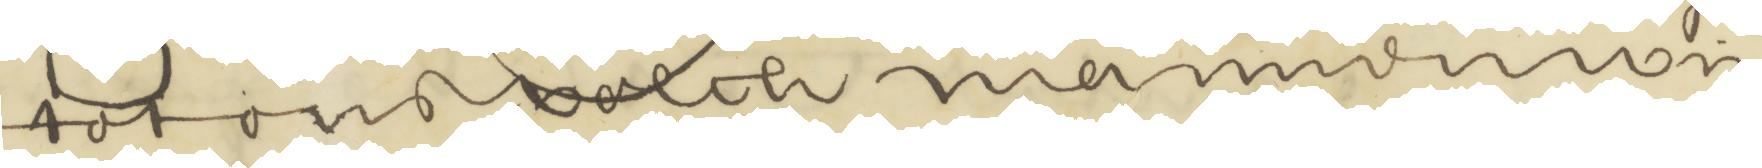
tot ons volck mannen wij
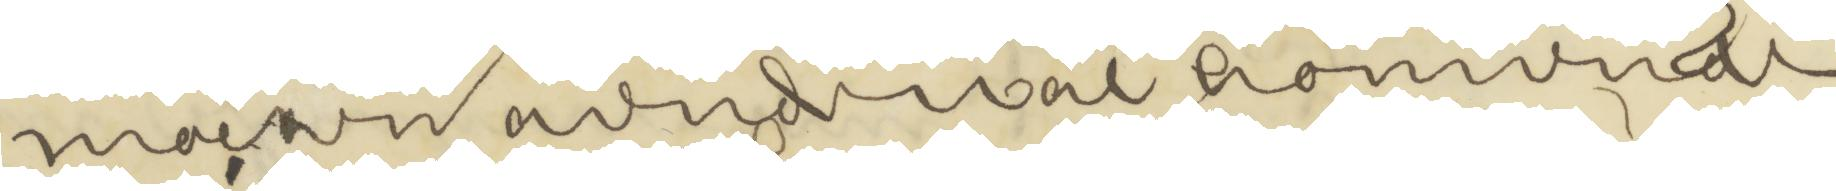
moeten aen de wal komende
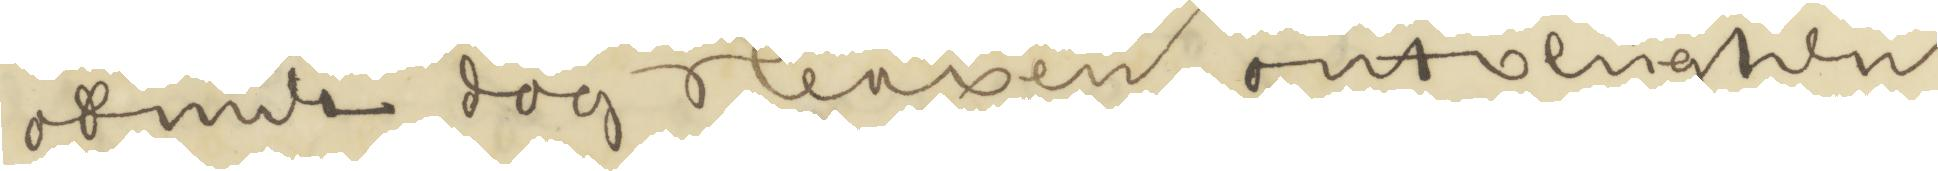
of niet dog sterven, ontvlugten
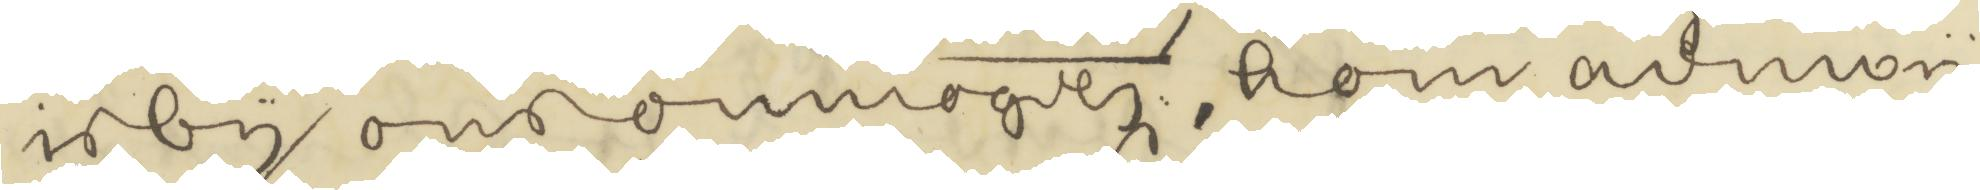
is bij ons onmogelijk, kom aen wij
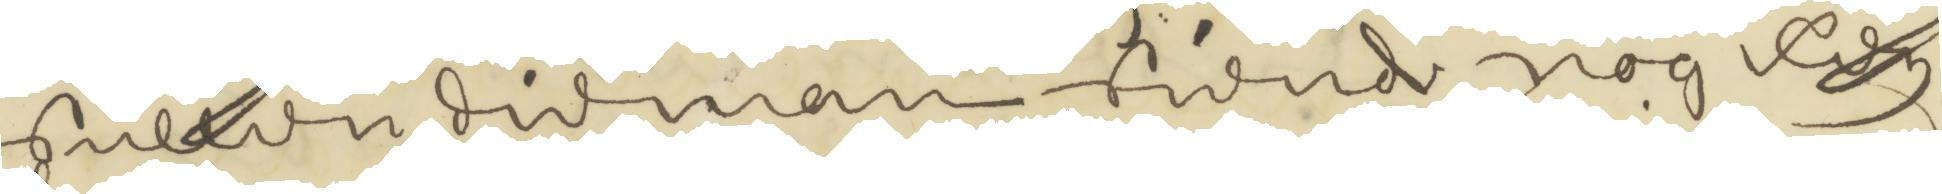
sullen dieman siende nog Een
